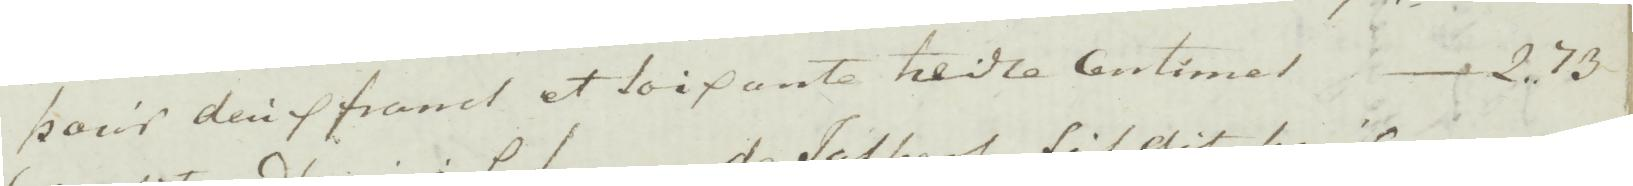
pour deux francs et Soixante treize Centimes — 2„73
